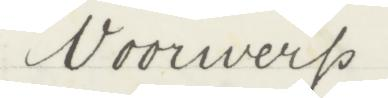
Voorwerp
